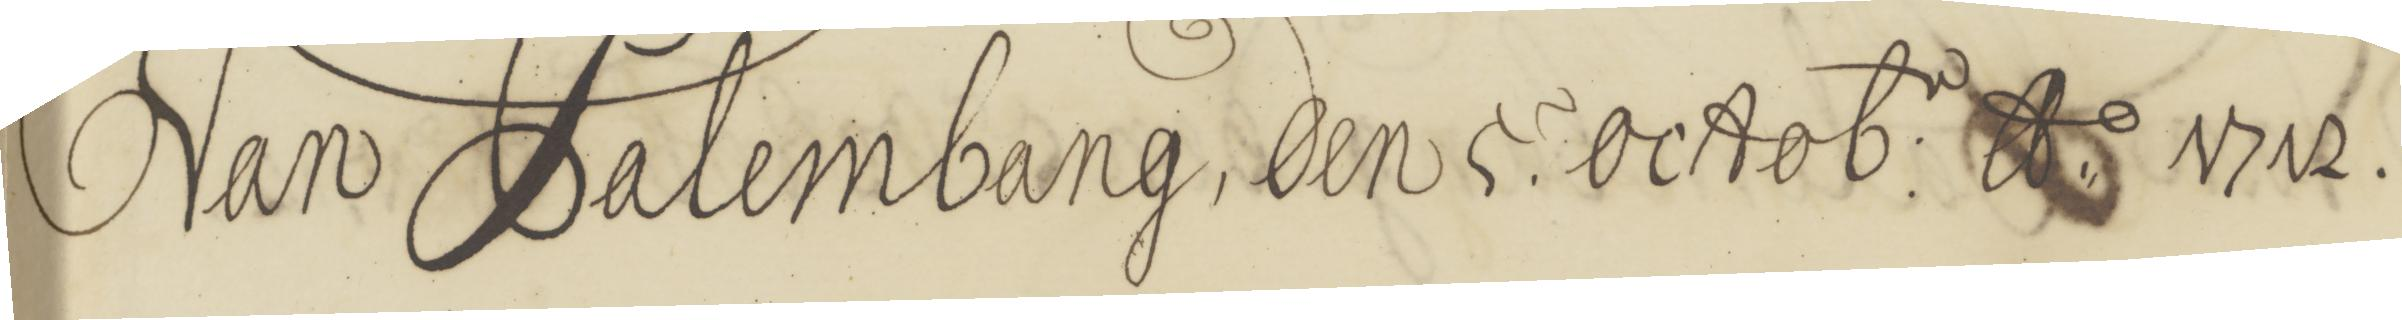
Van Palembang, den 5:' Octob:r A„o 1712.
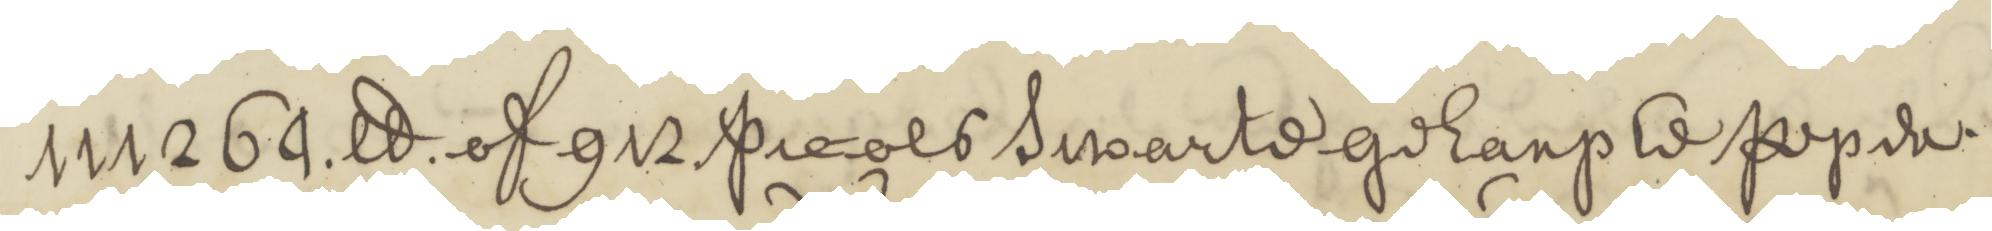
111264. lb. of 912. picols swarte geharpte peper
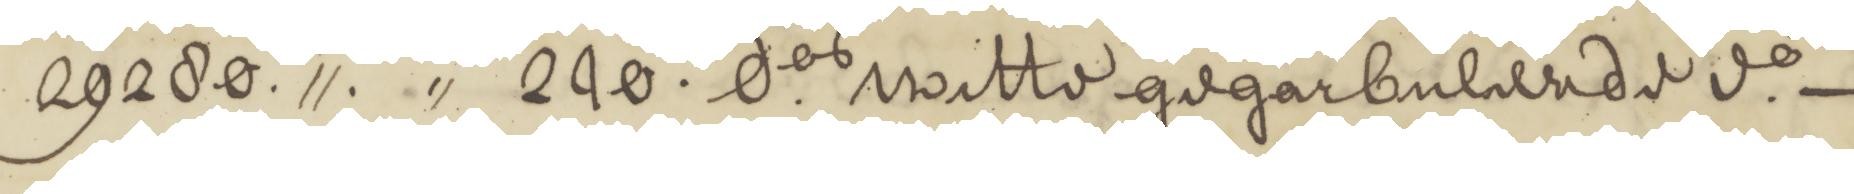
29280. „ . „ 240. d.os witte gegarbuleerde d.o —
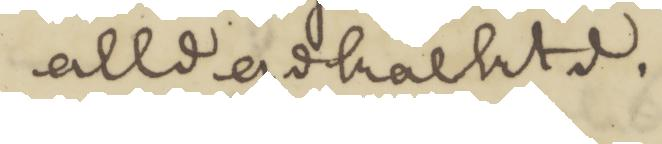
alle gekalkte.
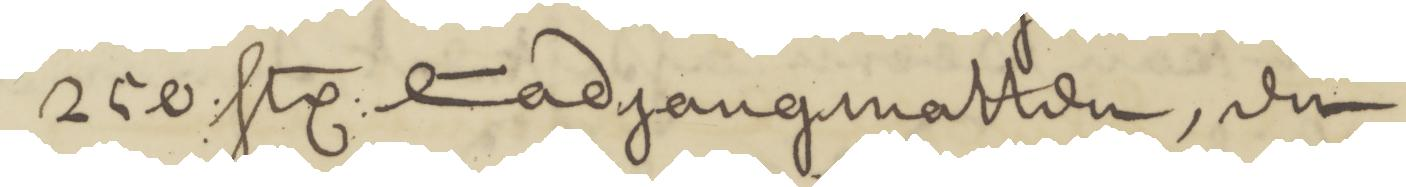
250: stx: Codjongmatten, en
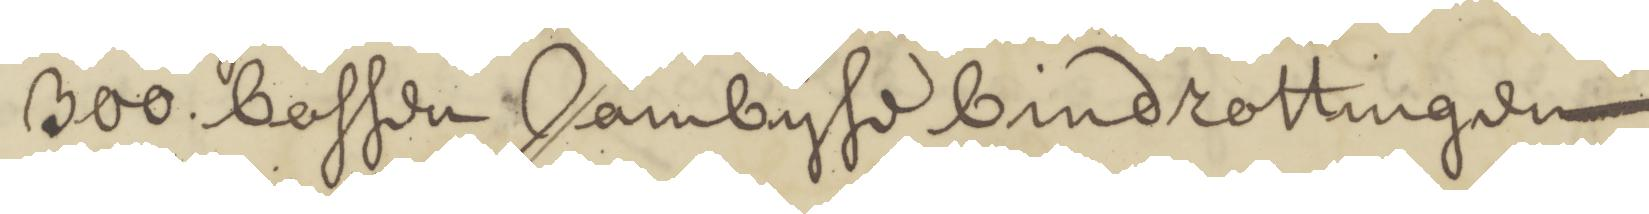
300. bossen Jambijse bindrottingen
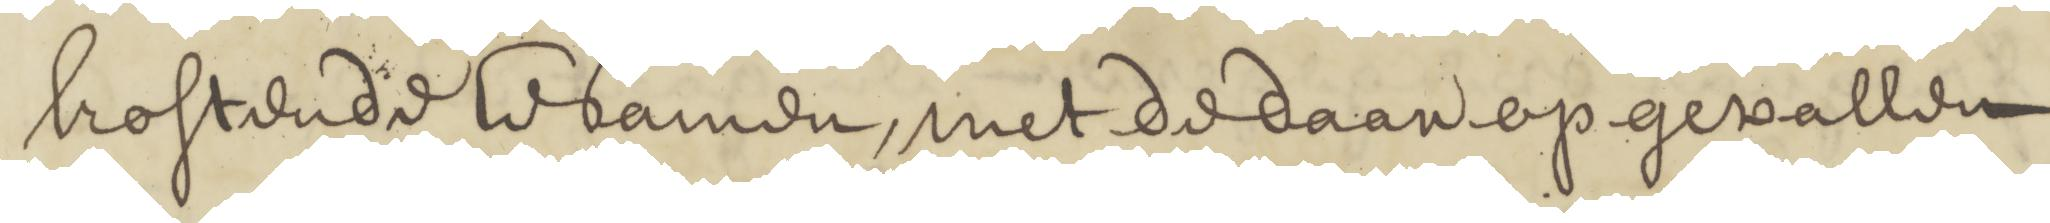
kostende tesamen, met de daar op gevallen
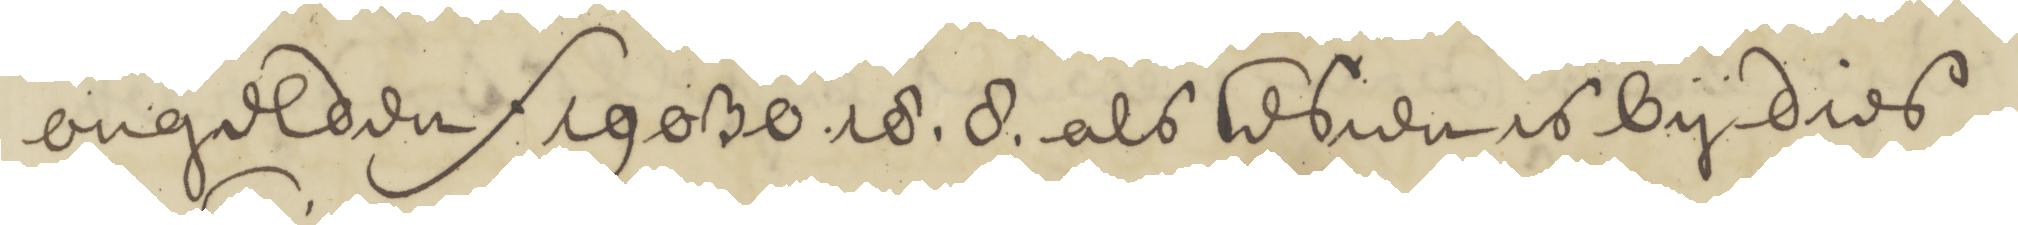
ongelden ƒ 19030. 18. 8. als tesien is bij dies
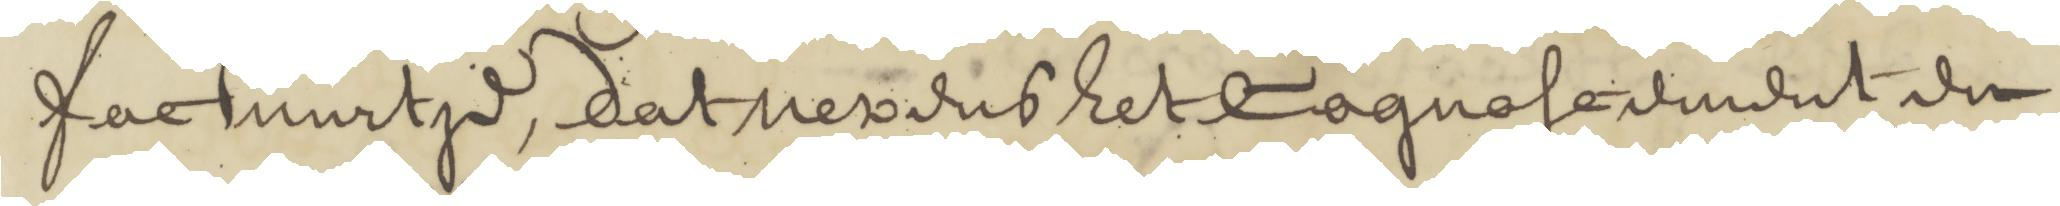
factuurtje, dat nevens het Cognoscement en
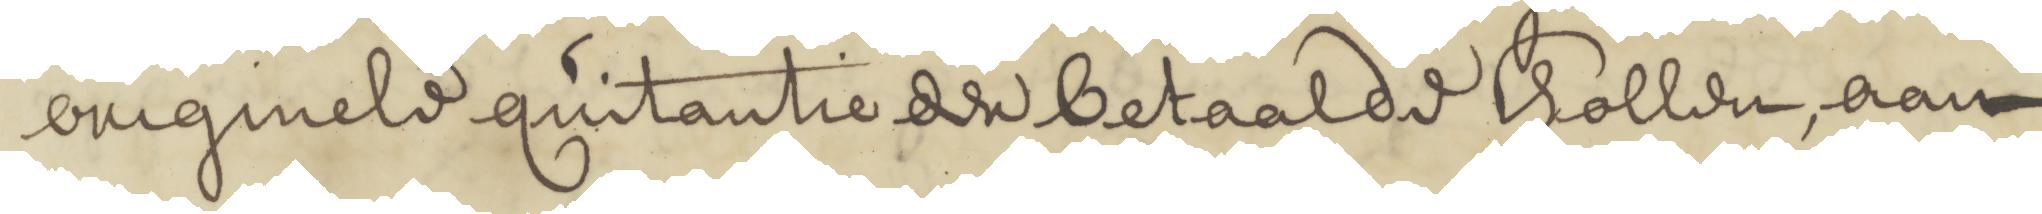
originele quitantie der betaalde thollen, aan
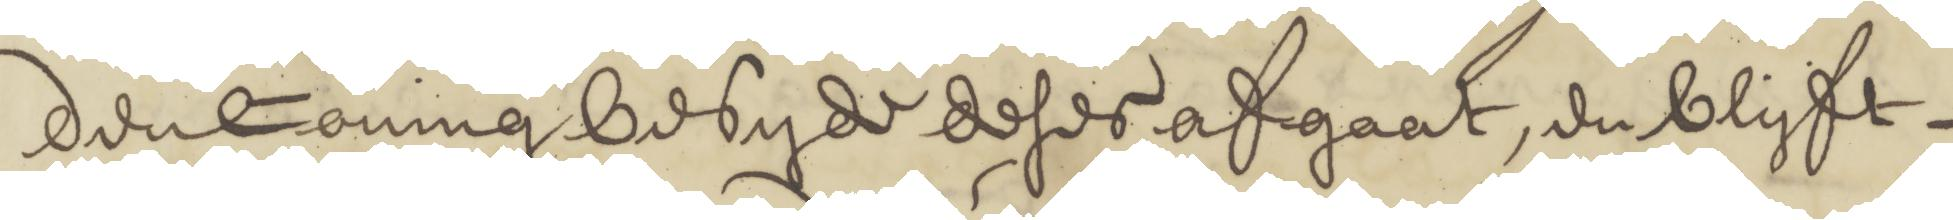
den Coning besyde deses af gaat, en blijft —
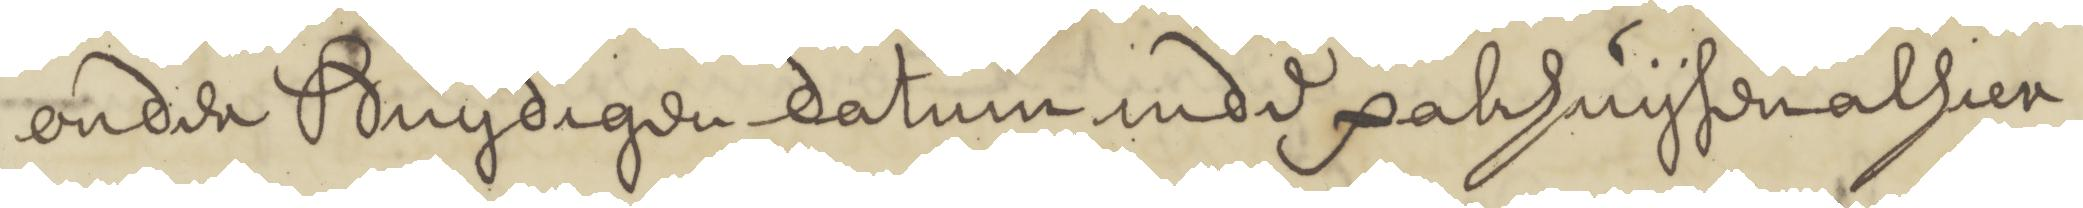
onder Huijdigen datum inde pakhuijsen alhier
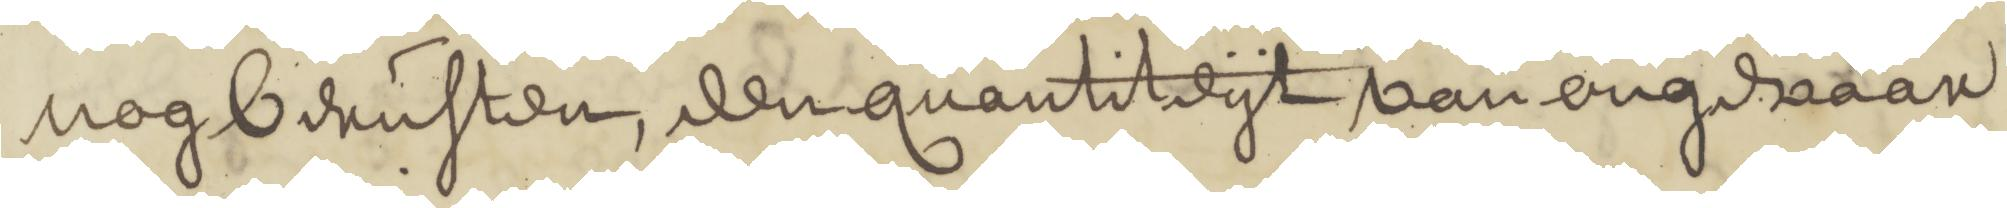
nog berusten, een quantiteijt van ongevaar
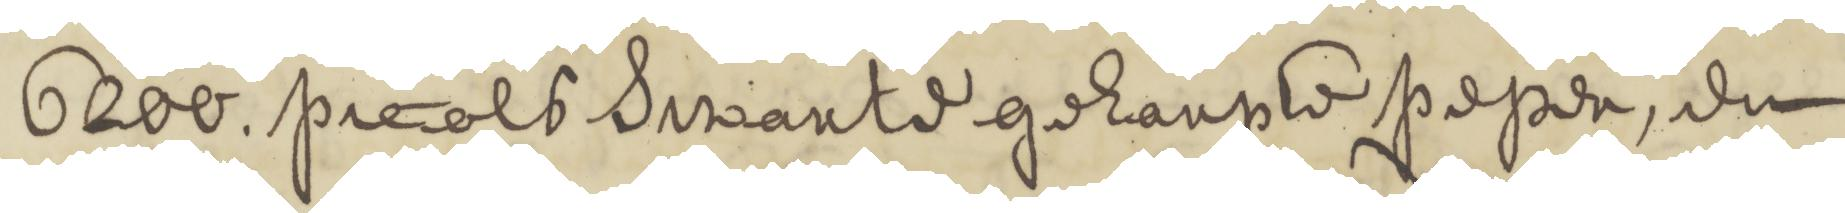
6200. picols swarte geharpte peper, en
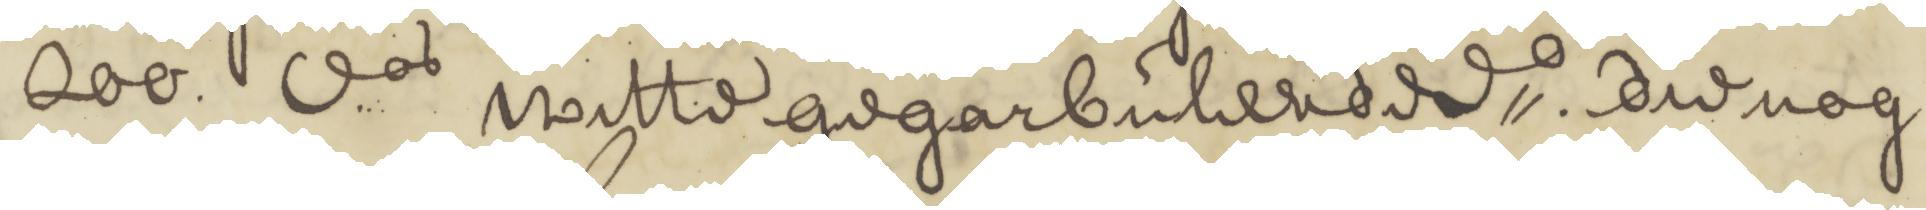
200. d:os witte gegarbuleerde d„o. die nog
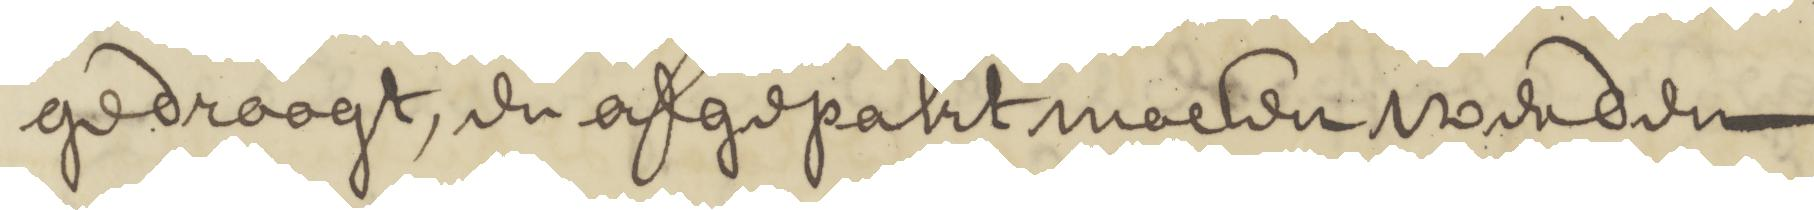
gedroogt, en afgepakt moeten werden
